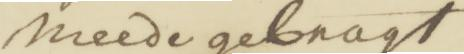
meede gebragt
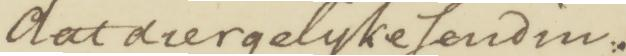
dat diergelijke sendin:
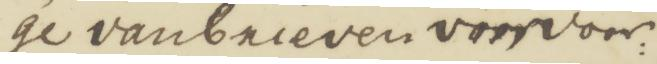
ge van brieven van voor:
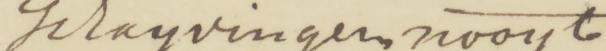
schryvingen nooijt
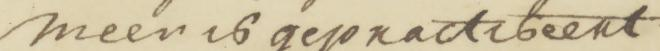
meer is gepractiseert
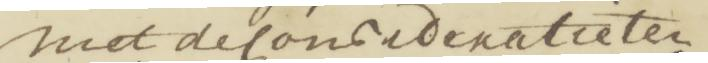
met de consideratie ten
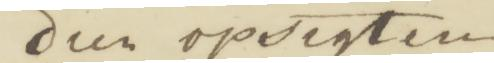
dien opsigten
